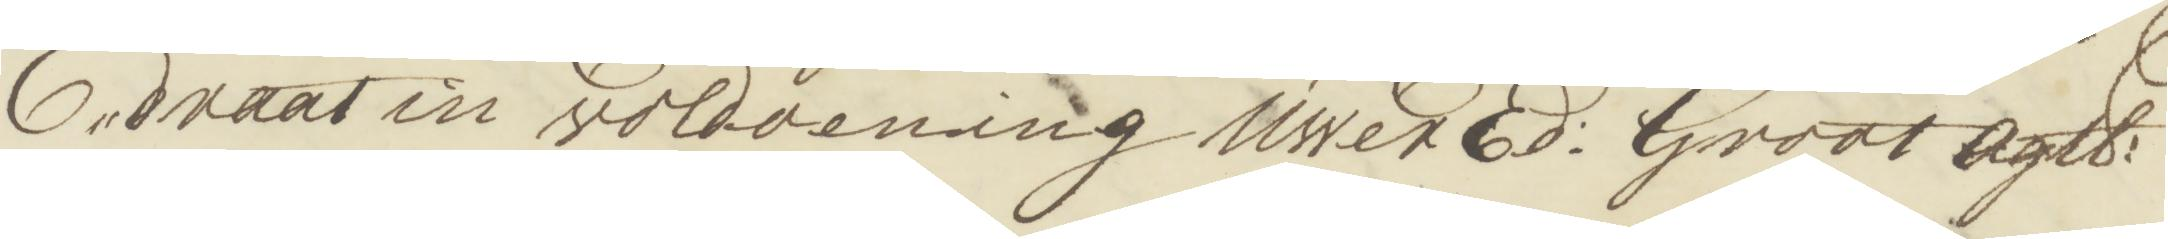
draat in voldoening uwer Ed: Groot agtb:
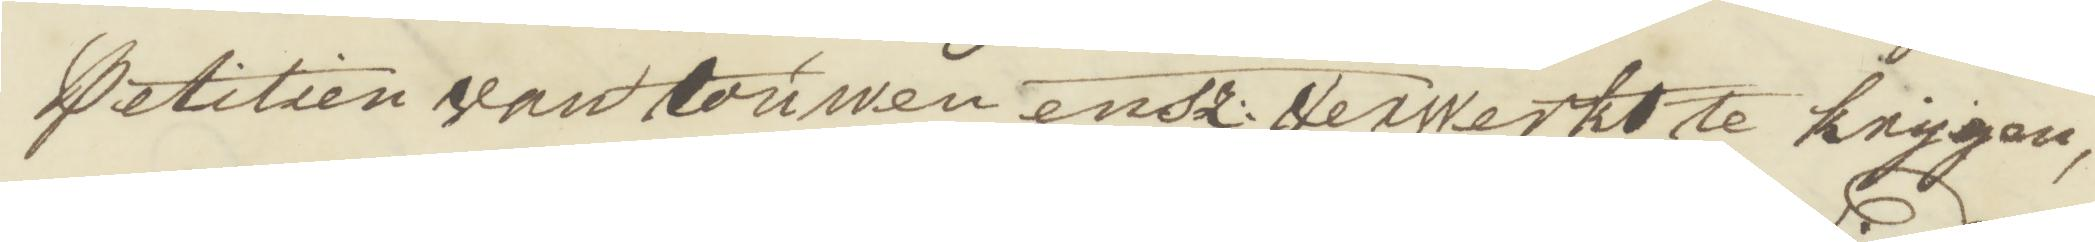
petitien van touwen ensz: verwerkt te krijgen,
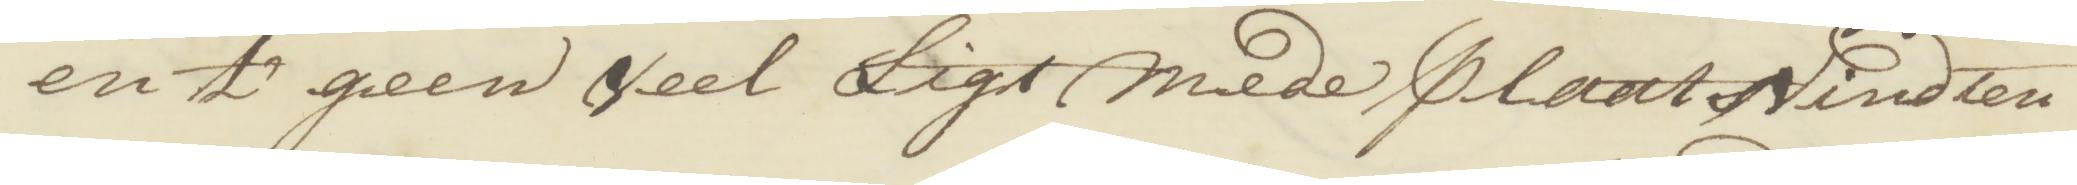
en t' geen veel Ligt mede plaatsvind ten
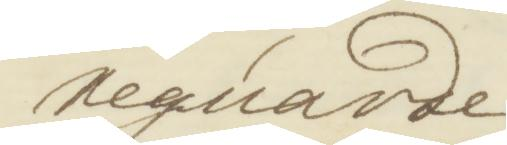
reguarde
